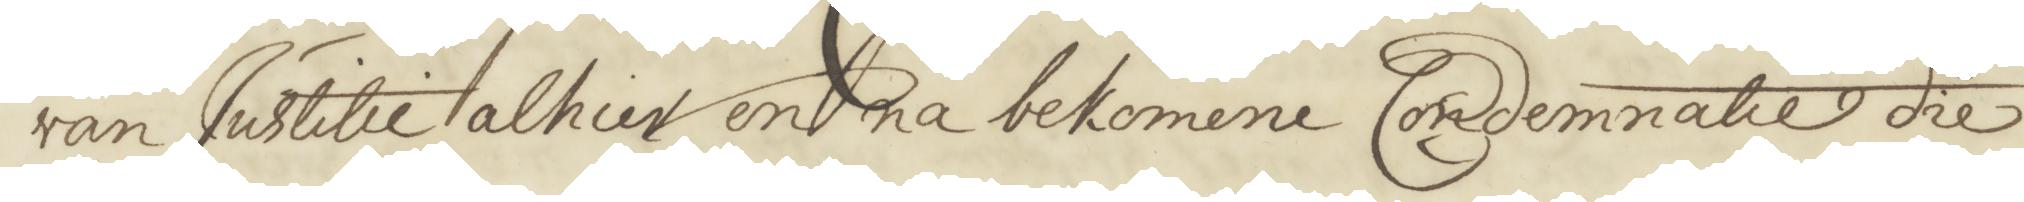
van Justitie alhier en na bekomene Condemnatie die
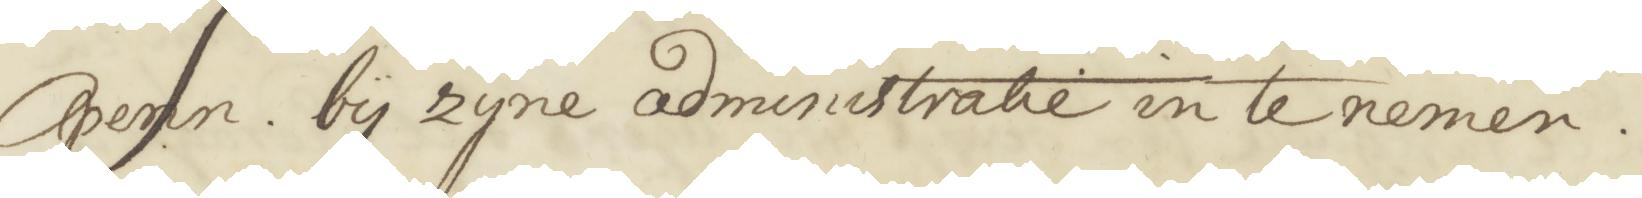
penn. bij zijne administratie in te nemen
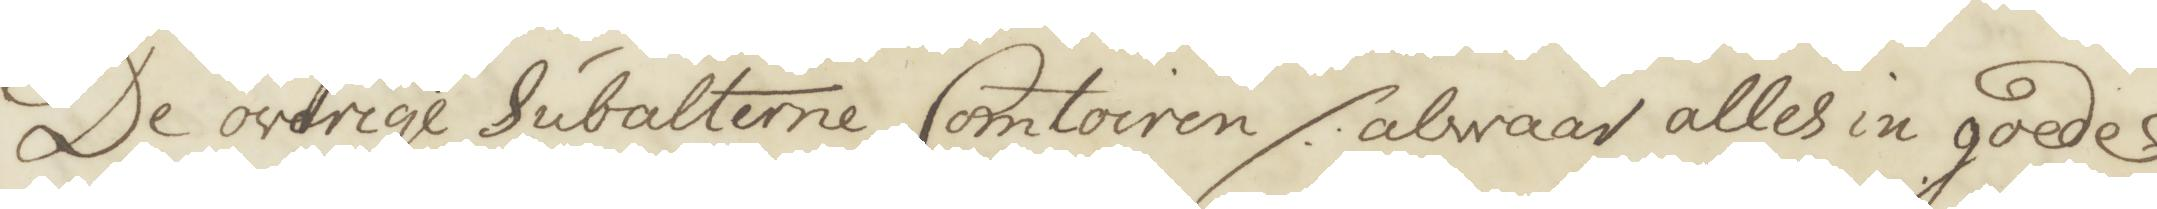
De overige subalterne Comtoiren /:alwaar alles in goede
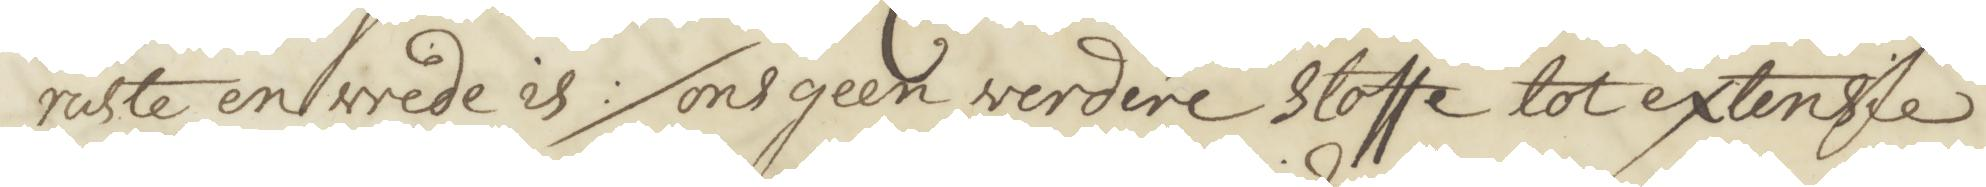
ruste en vrede is:/ ons geen verdere stoffe tot extensie
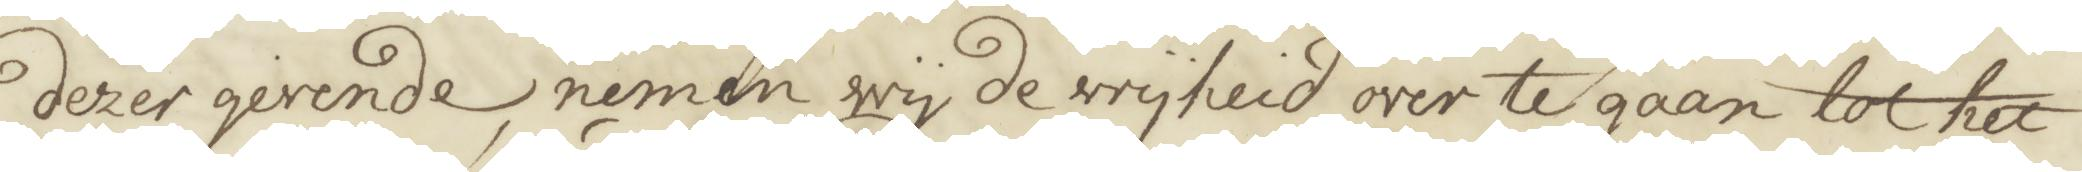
dezer gevende, nemen wij de vrijheid over te gaan tot het
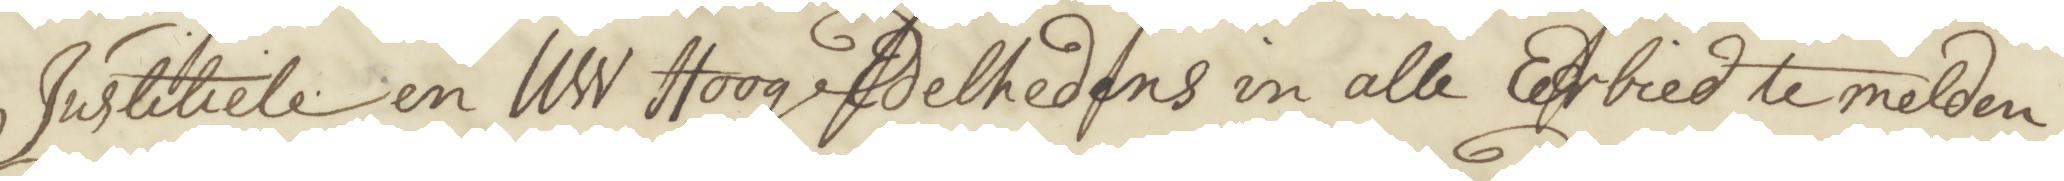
Justitiele en UW Hoog Edelhedens in alle Eerbied te melden
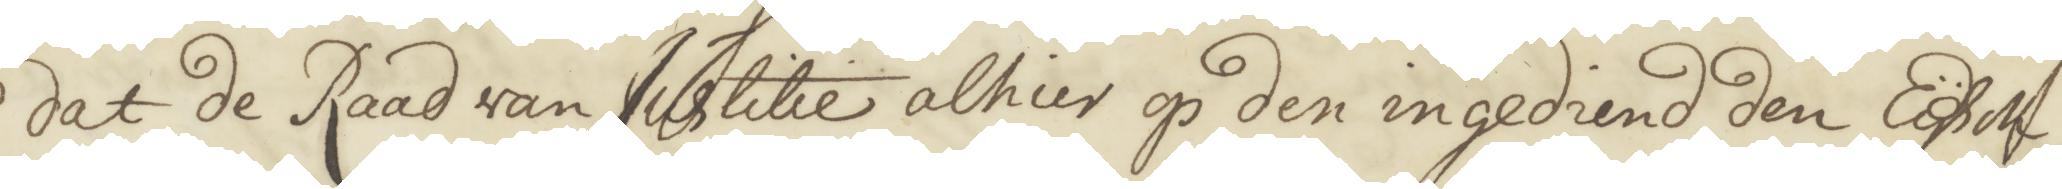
dat de Raad van Justitie alhier op den ingediend den Eijsch
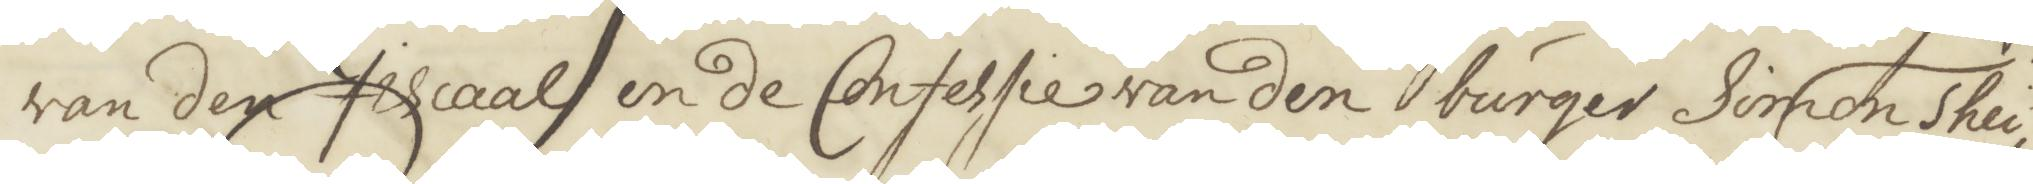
van den fiscaal en de Confessie van den burger Simon Thei„
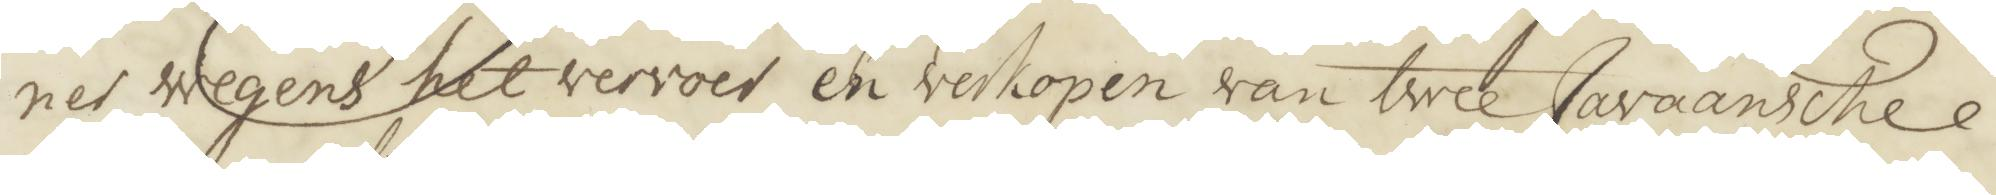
ner wegens het vervoer en verkopen van twee Javaanschee
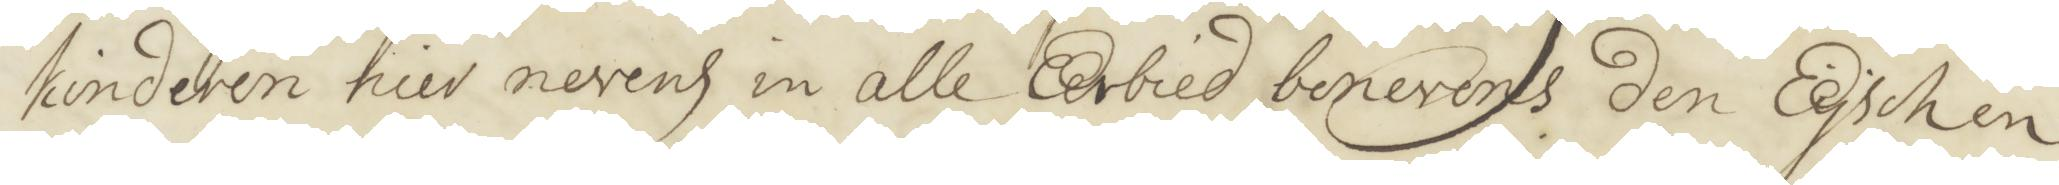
kinderen hier nevens in alle Eerbied benevens den Eijschen
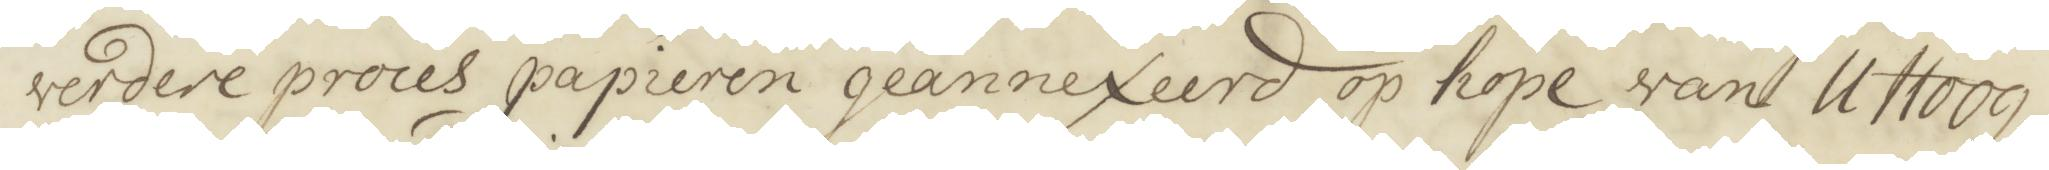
verdere proces papieren geannexeerd op hope van U Hoog
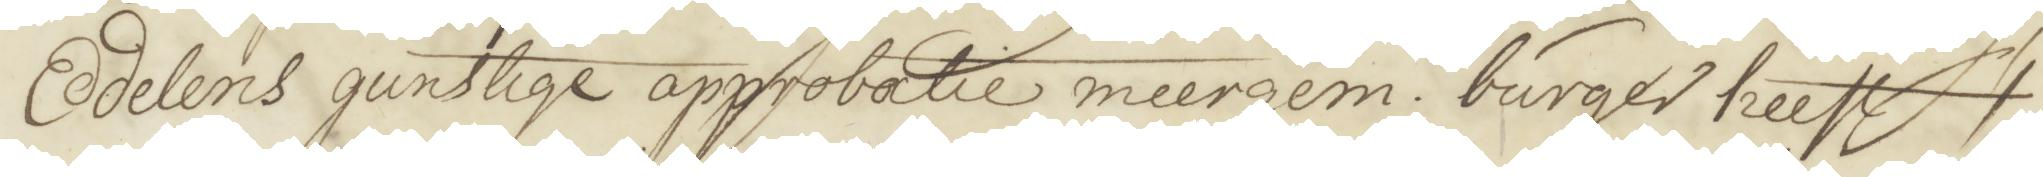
Edelens gunstige approbatie meergem. burger heeft
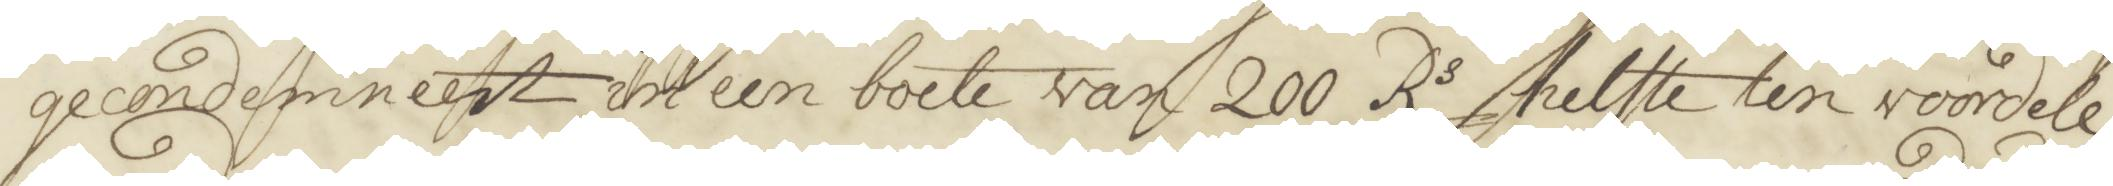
gecondemneert in een boete van 200 R=s helfte ten voordele
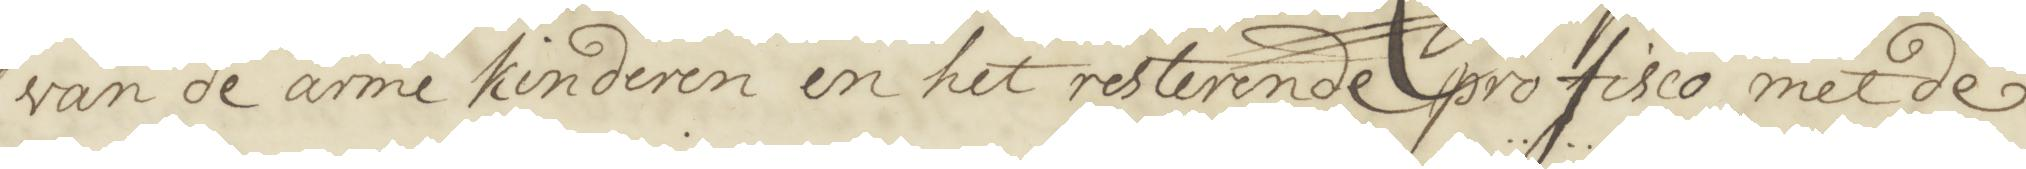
van de arme kinderen en het resterende pro fisco met de
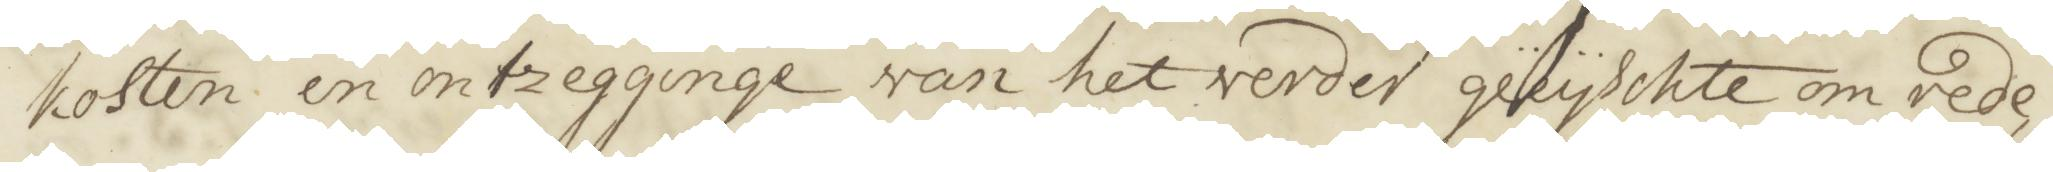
kosten en ontzegginge van het verder geëijschte om rede„
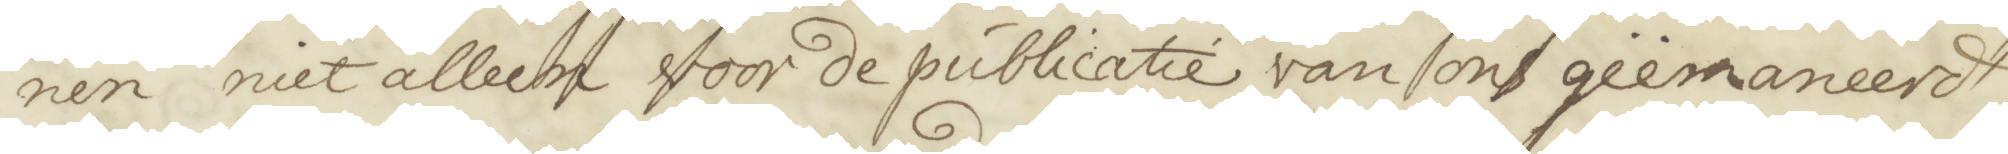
nen niet alleen voor de publicatie van ons geëmaneerd
